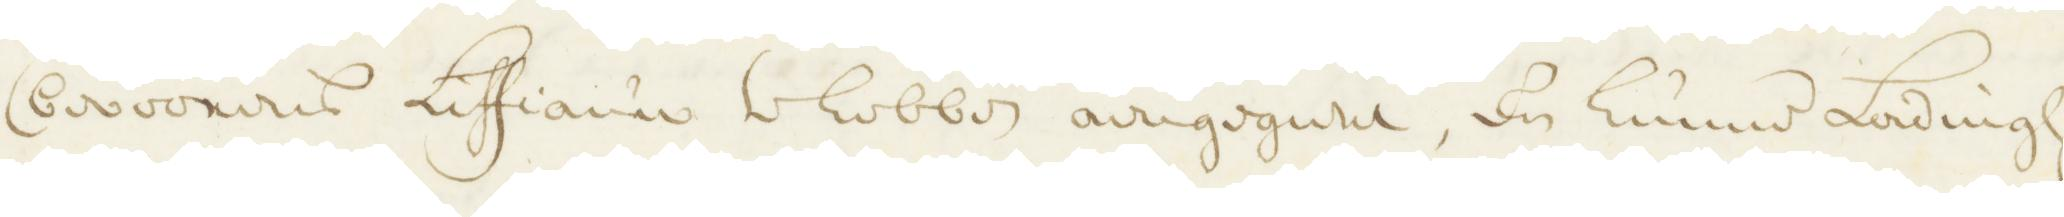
bevoorens liffiauw te hebben aengegiert, En hunne ladingh
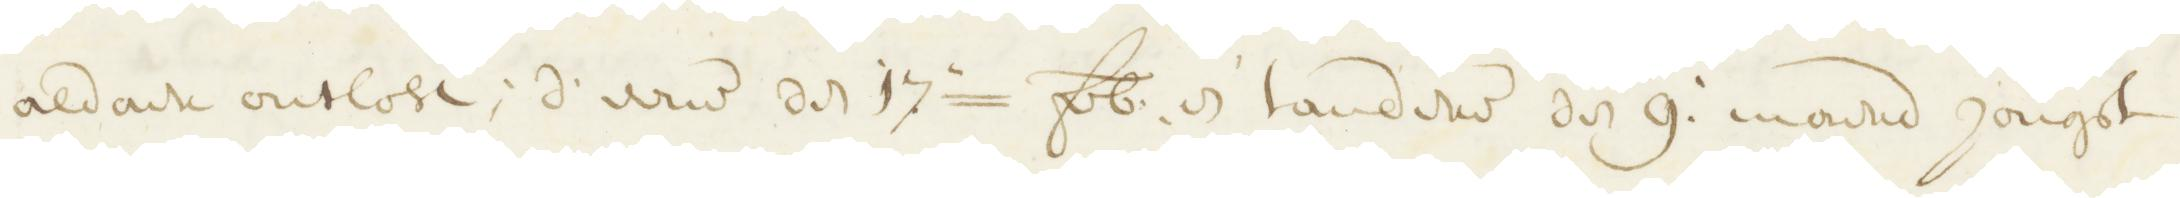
aldaer ontlost; d’ eene den 17=' feb. en 'tandere den 9. maerd jongst
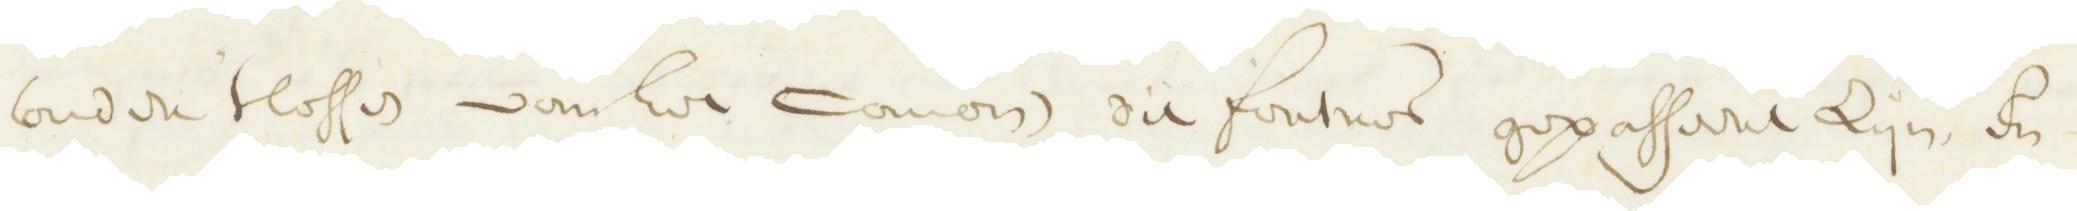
(onder 'tlossen van het canon) dit fortres gepasseert zijn, En
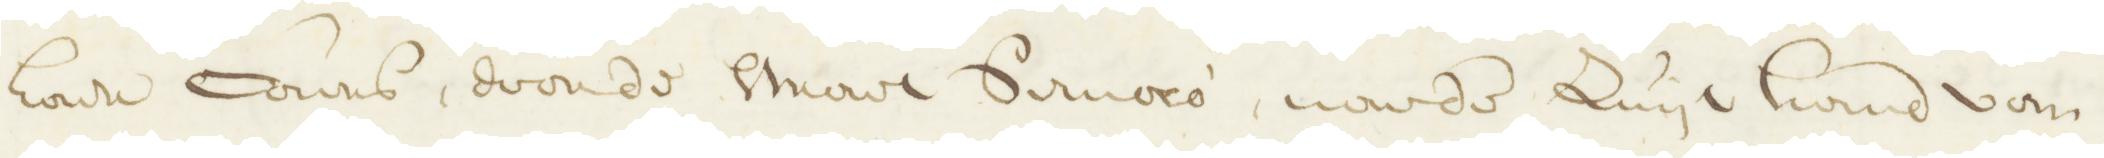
haer cours, door de straet semoco, naerde zuijt kand van
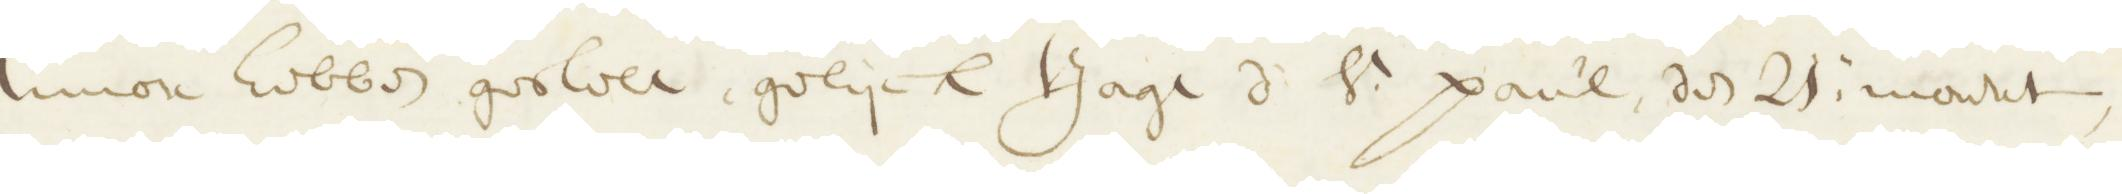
timor hebben gestelt, gelijck 't jagt d s:t paul, den 21:' maert,
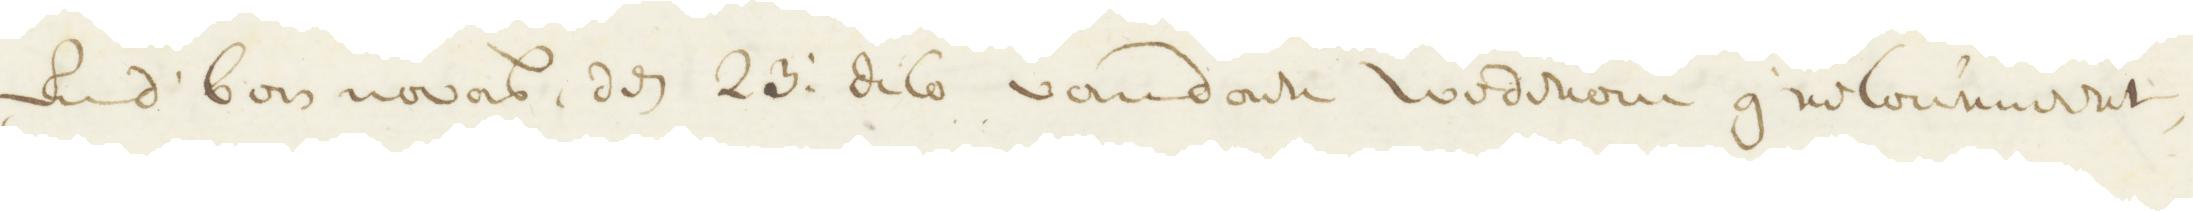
En d’ bon novas, den 23.' dito van daer wederom g’retourneert,
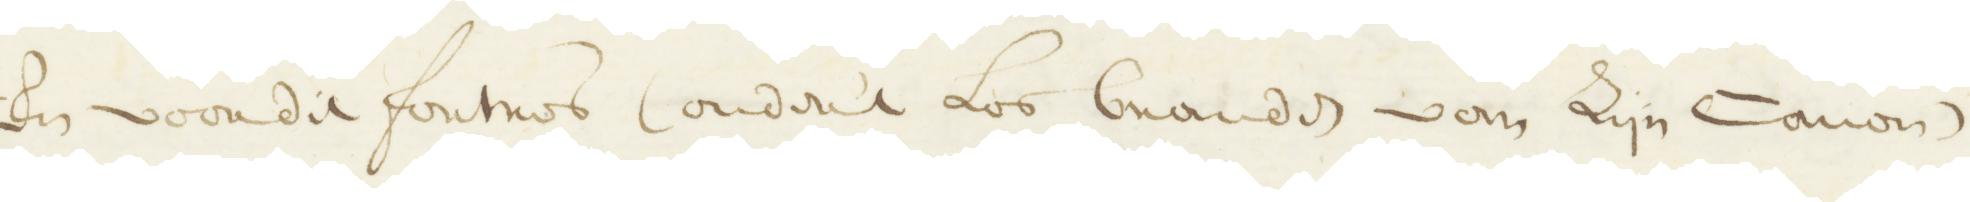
En voor dit fortres (onder ’t los branden van zijn Canon)
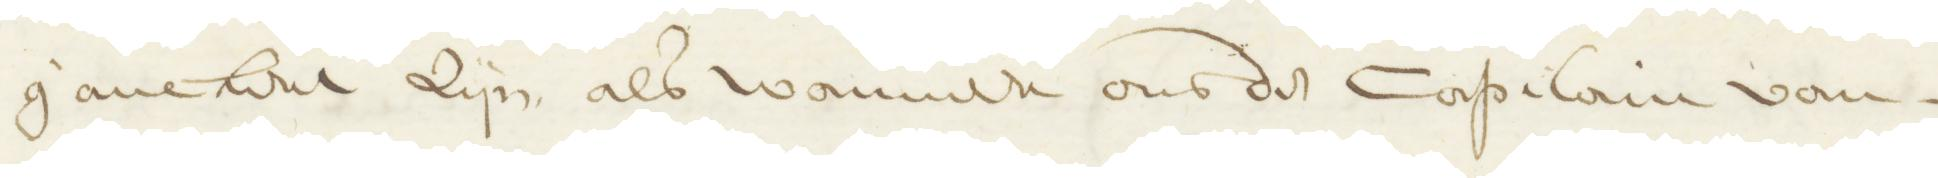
g’anckert zijn, als wanneer ons de Capitain van
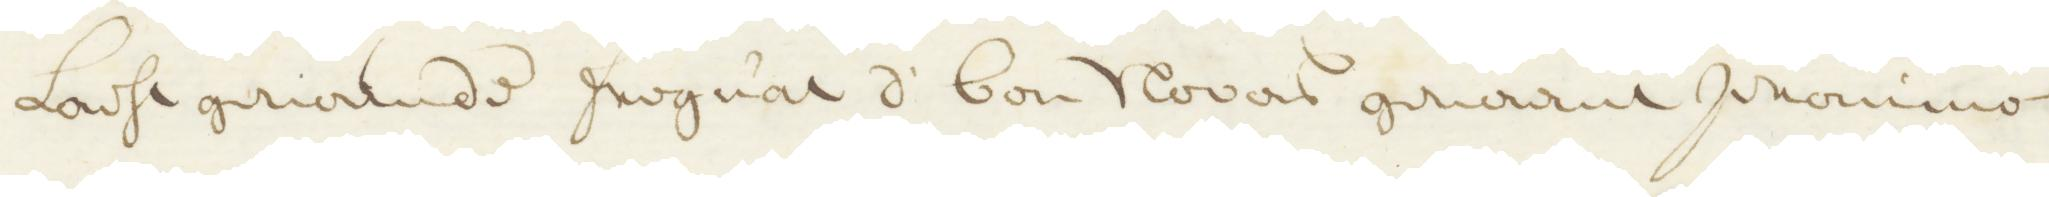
laest genoemde freguat d’ bon novas genaamt jeronimo
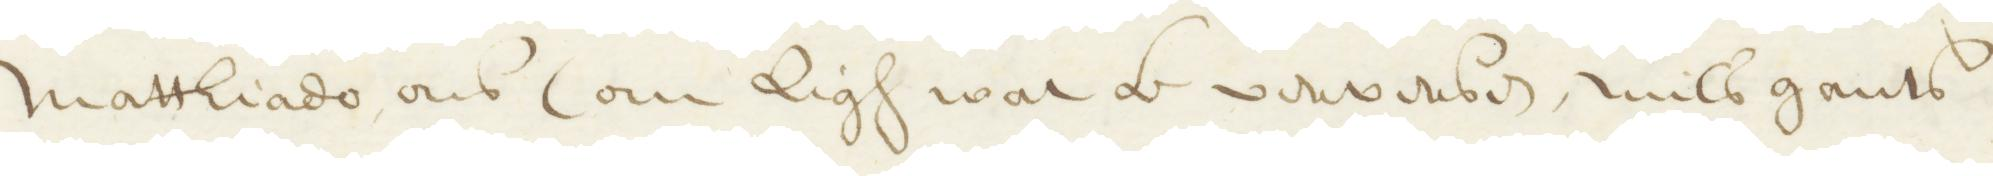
matthiado, ons (om zigh wat te verversen, mitsgants
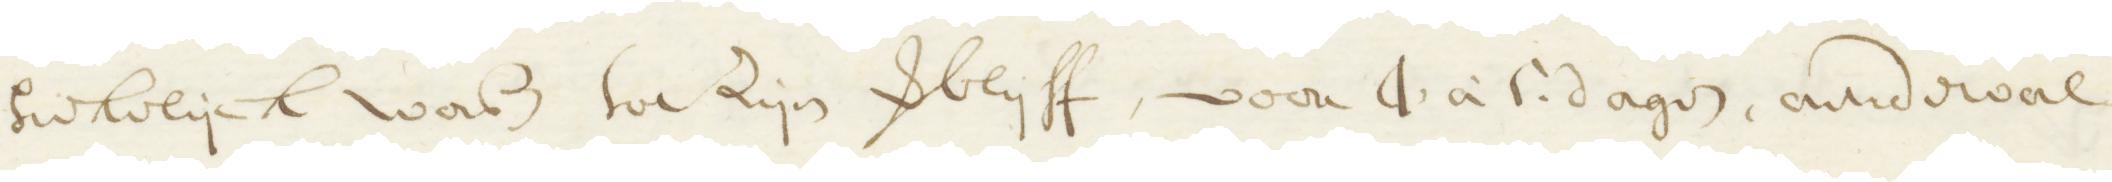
siekelijck was) tot zijn verblijff, voor 4 â 5. dagen, aen de wal
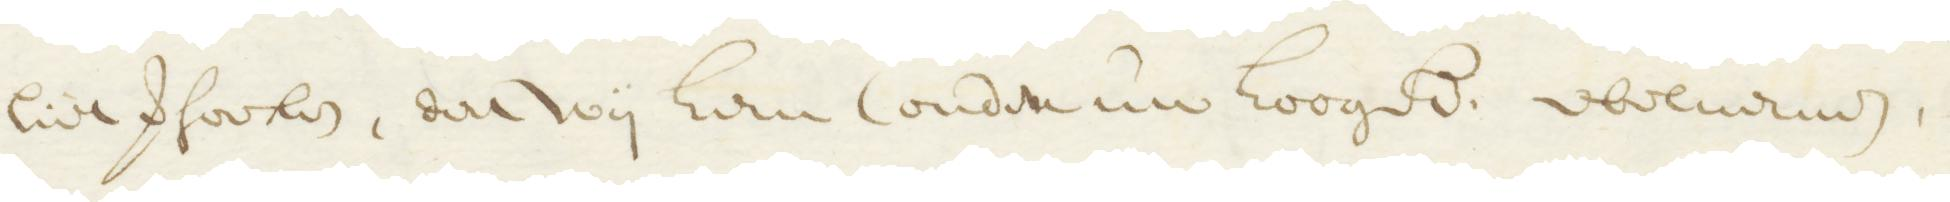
liet versoeken, dat wij hem (onder uw hoog Ed: welnemen,
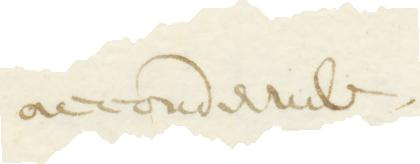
accordeerde
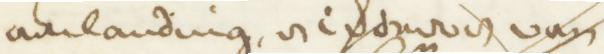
aenlanding, en 't verbreven van
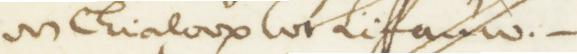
een Chialoop tot Liffauw.—
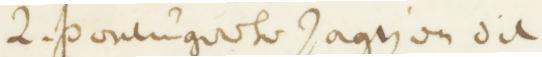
2. portugeese jagtjen dit
